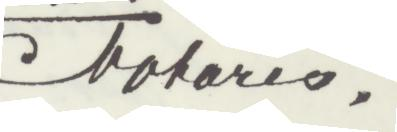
Notaris,
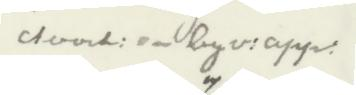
doorh: en byv: app:
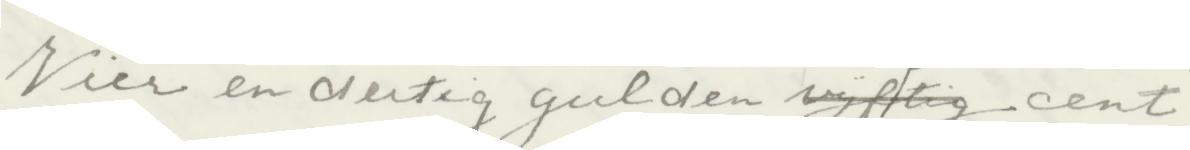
Vier en dertig gulden vijftig cent
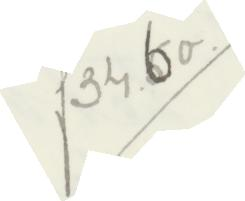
ƒ34.60.
